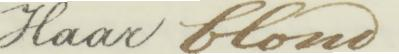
Haar blond
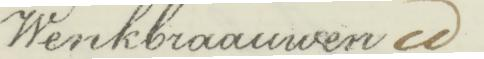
Wenkbraauwen id
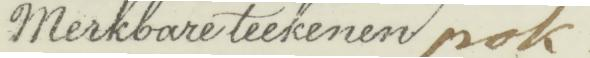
Merkbare teekenen pok
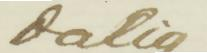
dalig
